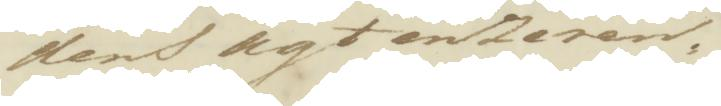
dens agt en zeven„
